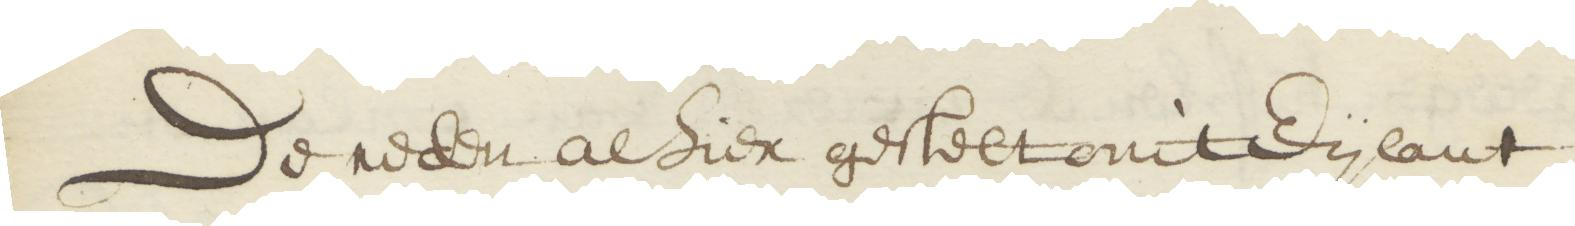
De reden alhier gestelt om ’t Eijlant
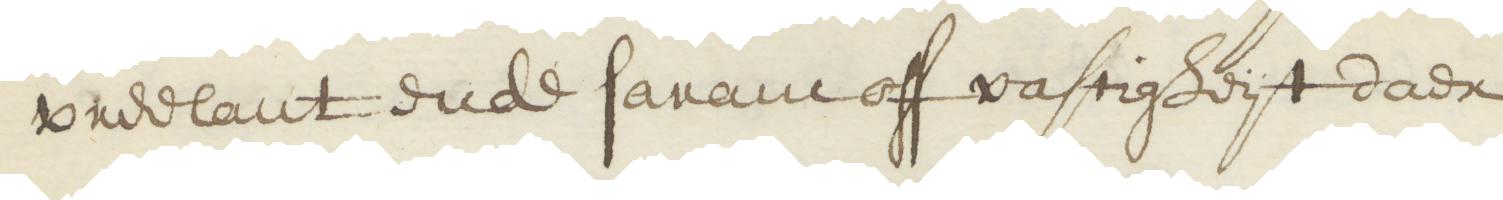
vreelant ende saram off vastigheijt daer
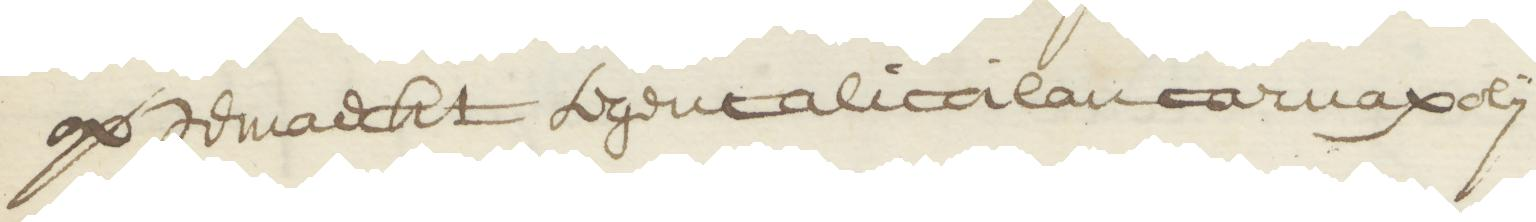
op gemaeckt tegen calicoilan carnapolij
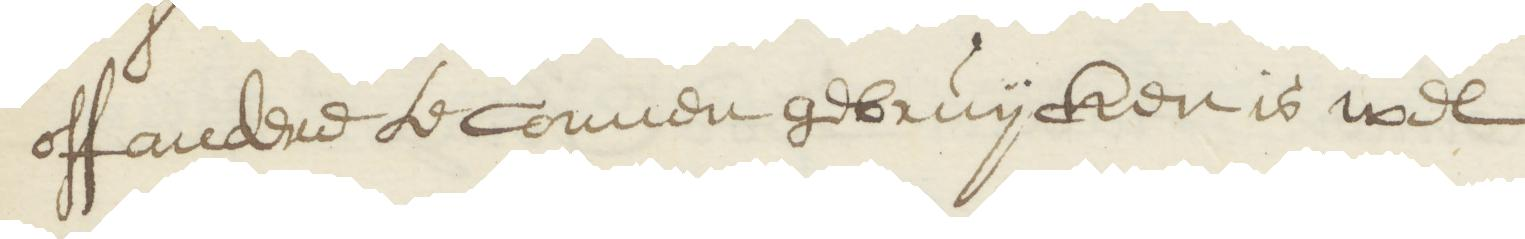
off andere te connen gebruijcken is wel
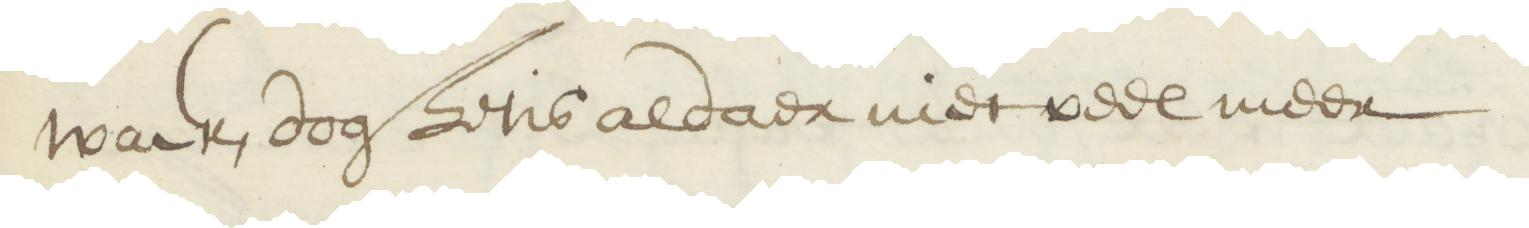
waer, dog het is aldaer niet veel meer
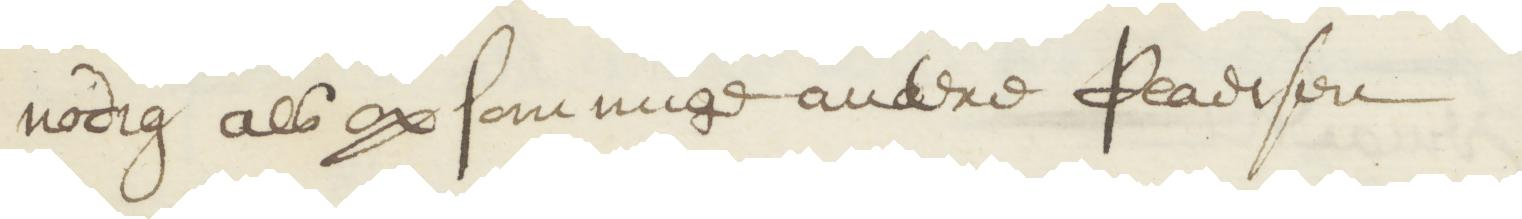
nodig als op sommige andere plaetsen
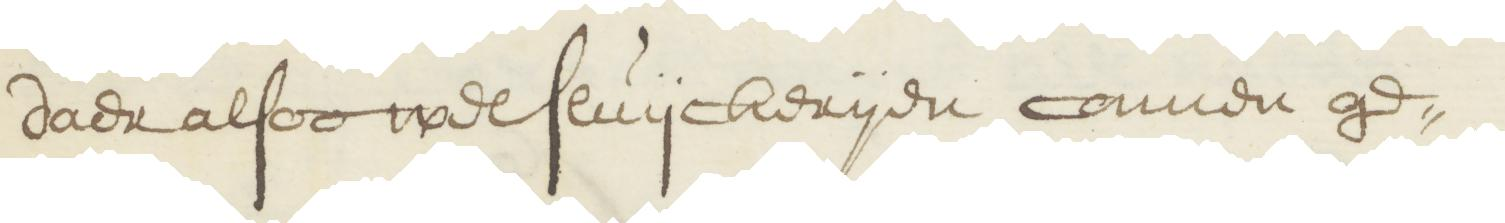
daer alsoo wel sluijckerijen connen ge„
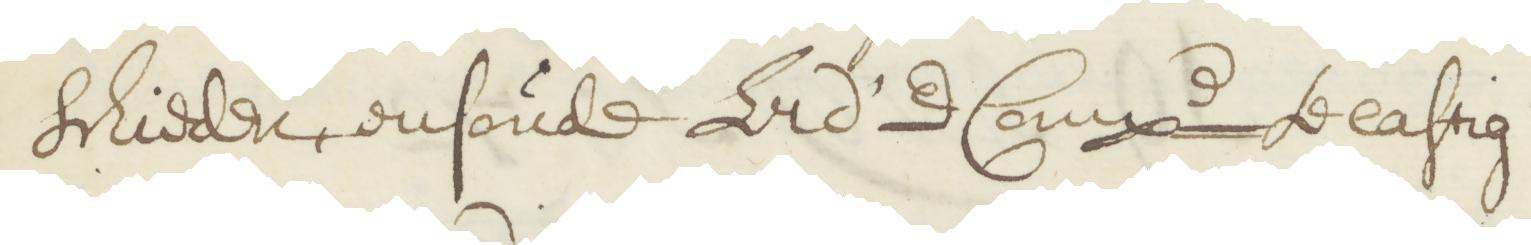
schieden, en soude het d'E Comp=e te lastig
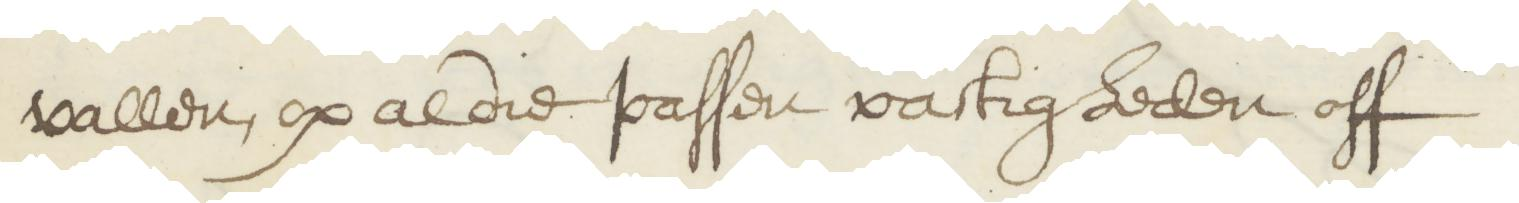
vallen, op al die passen vastigheden off
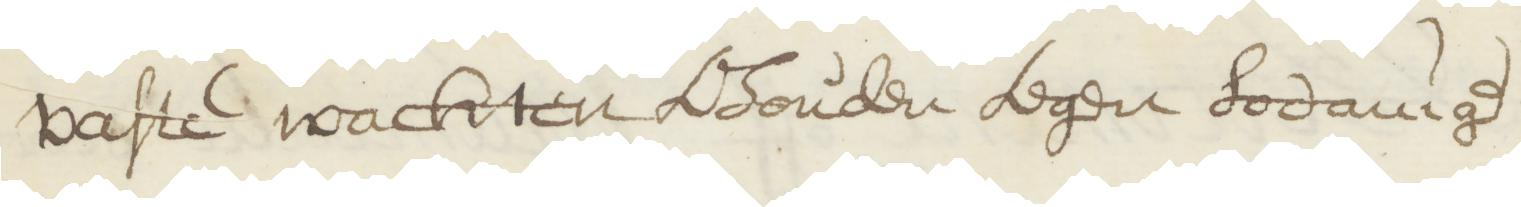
vaste wachten tehouden tegen sodanige
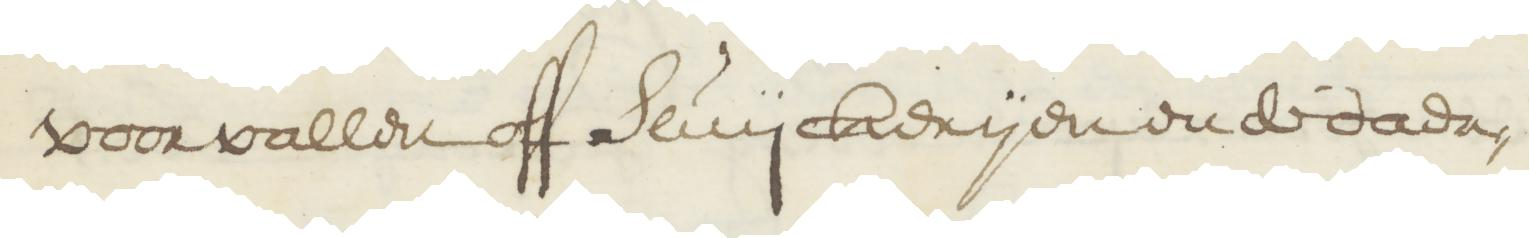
voorvallen off sluijckerijen en de daer„
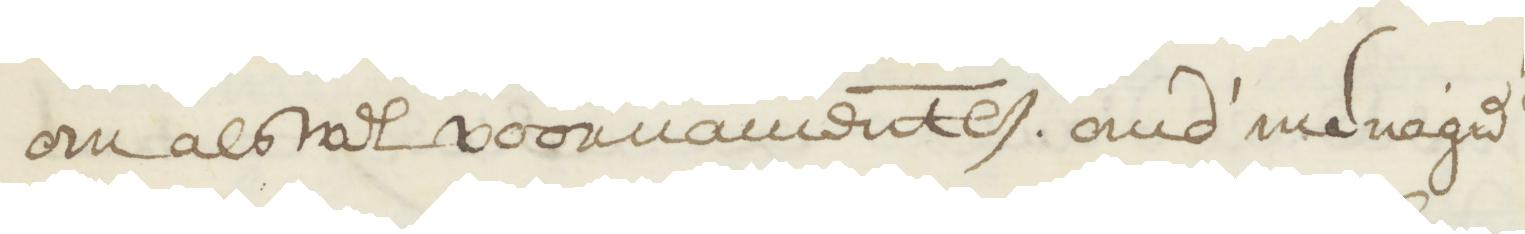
om als wel voornamentlijk om d’ menagie
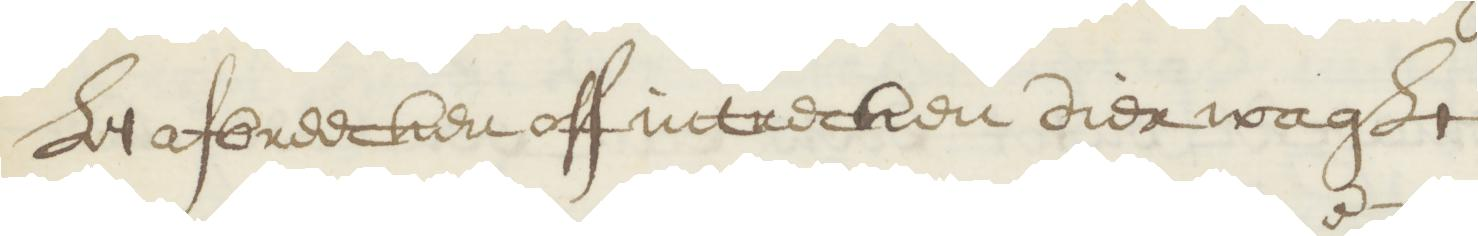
het afbreecken off intrecken dier waght
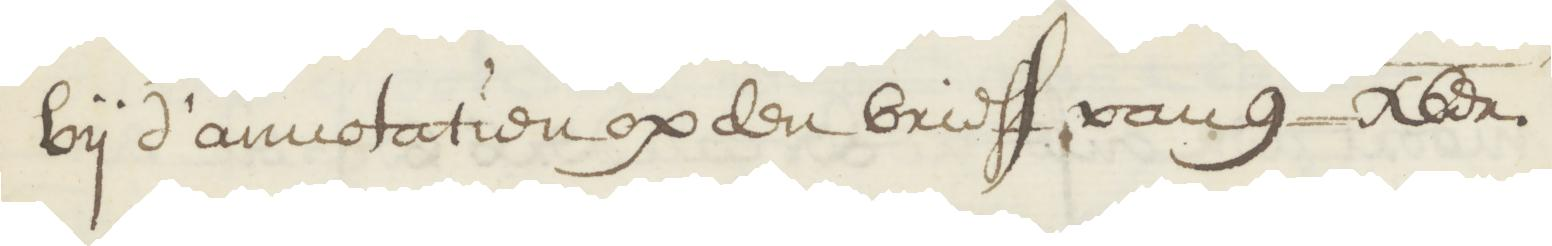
bij d’annotatien op den brieff van 9=e xber.
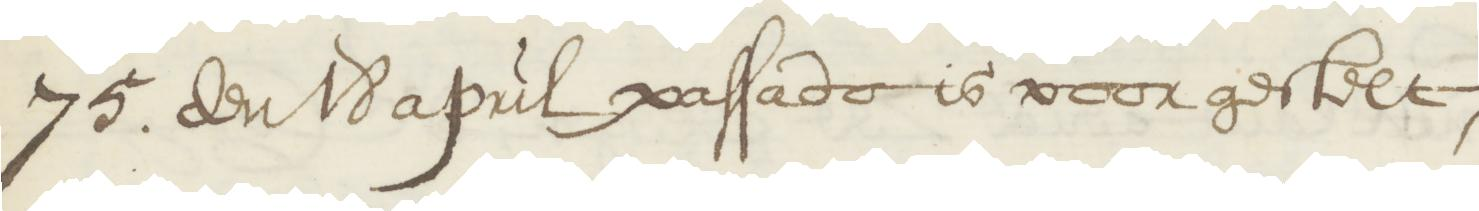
75. den 18 april passado is voor gestelt
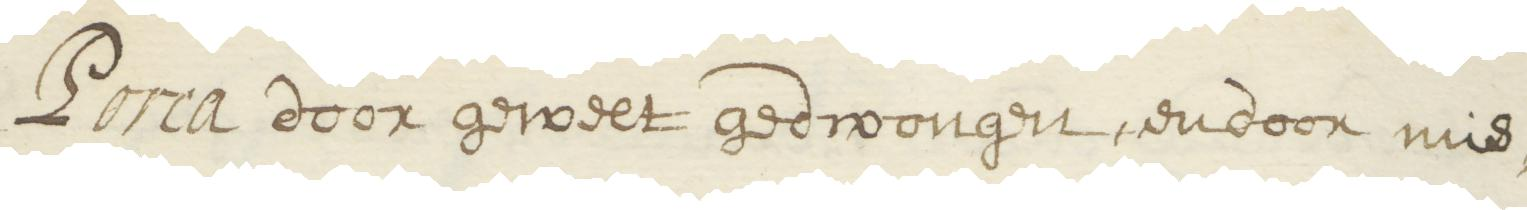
Porca door gewelt gedwongen, en door mis
